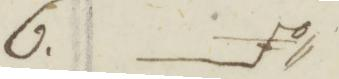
6. _„o
